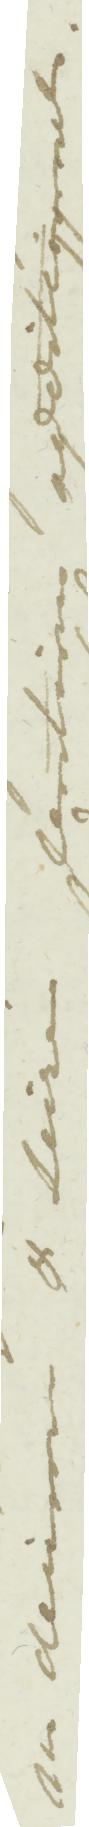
six decimes & seize centimes additionnel.
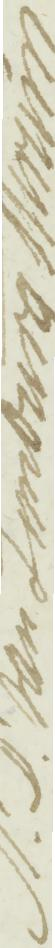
A: D: van Limburg Stirum
